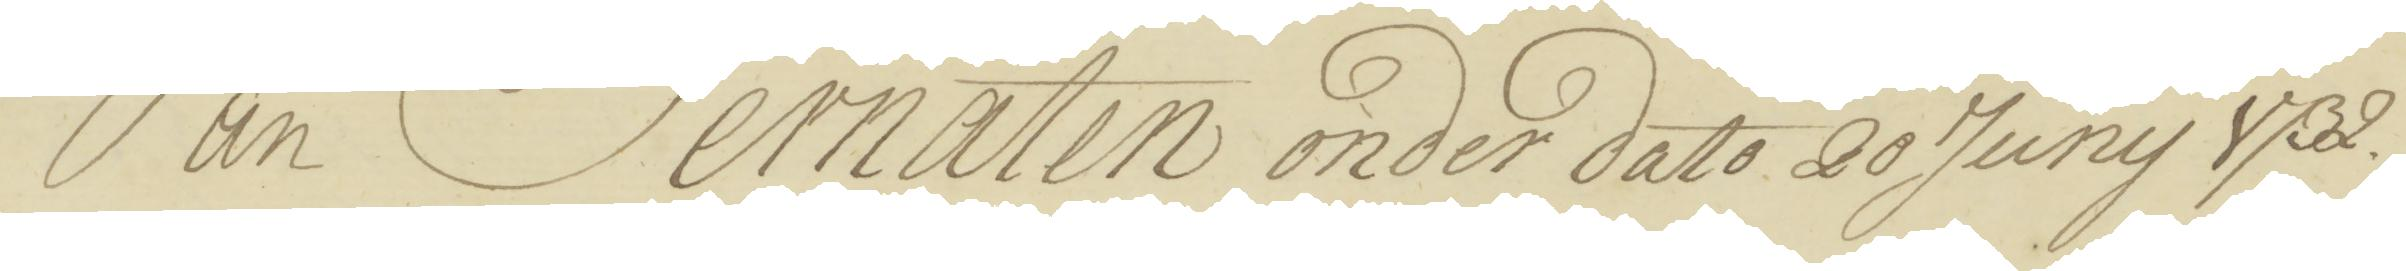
Van Ternaten onder dato 20 Juny 1732.
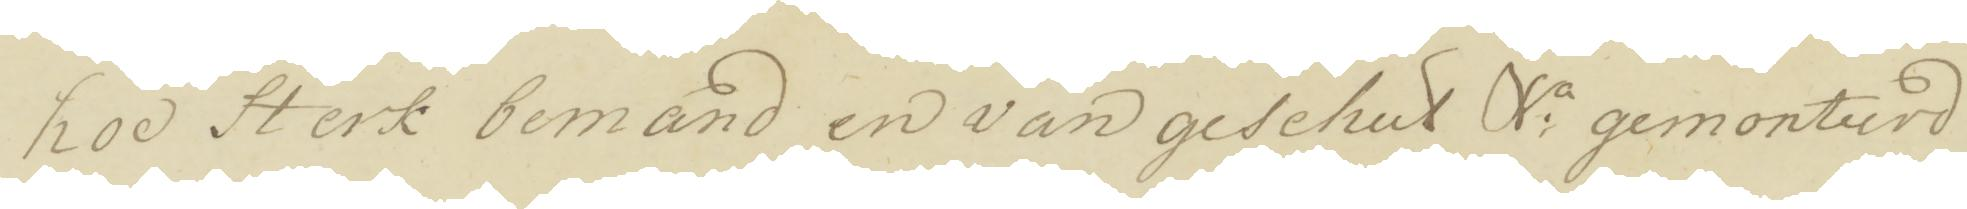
hoe sterk bemand en van geschut &„a gemonteerd
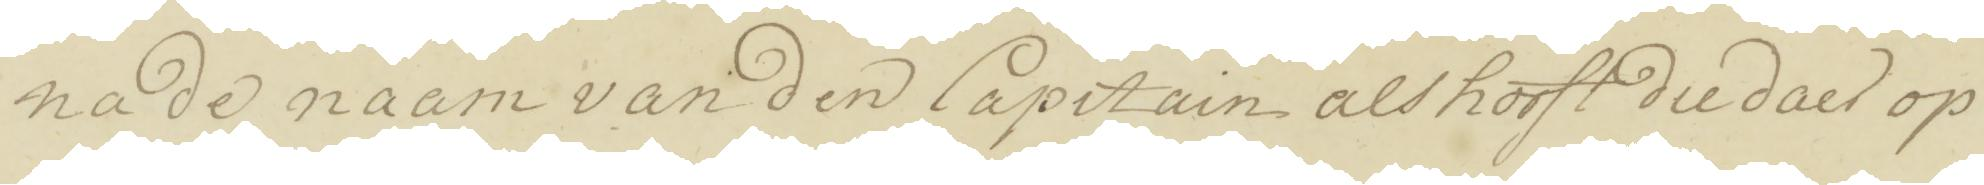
na de naam van den Capitain als hooft die daer op
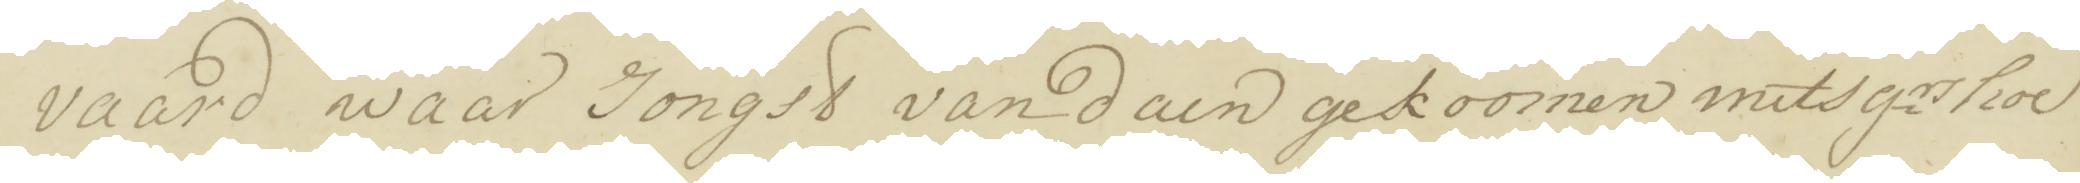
vaard waar Iongst van daen gekoomen mitsg=rs hoe
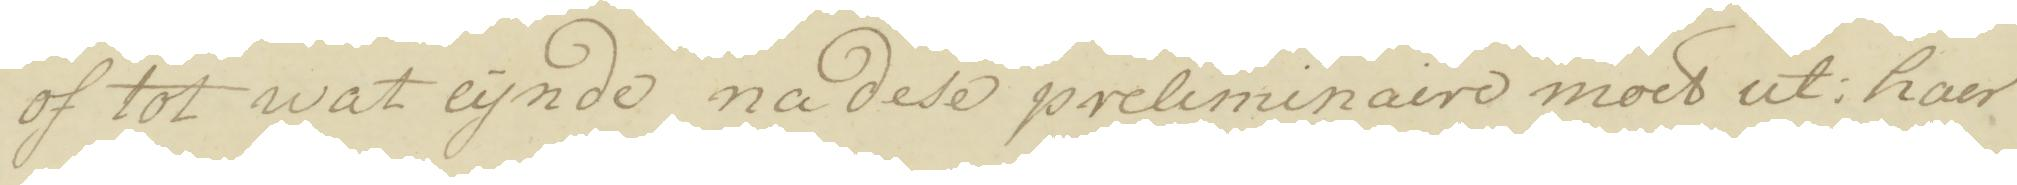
of tot wat eijnde na dese preliminaire moet ul; haer
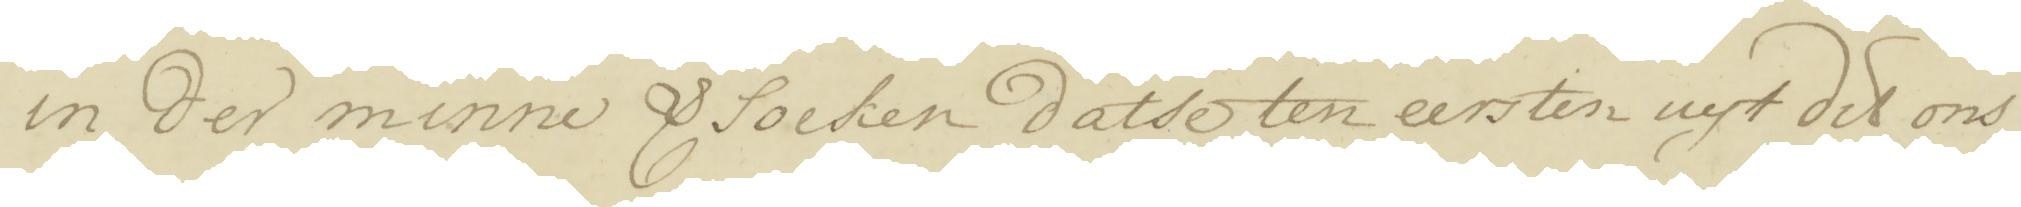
in der minne versoeken datse ten eersten uyt dit ons
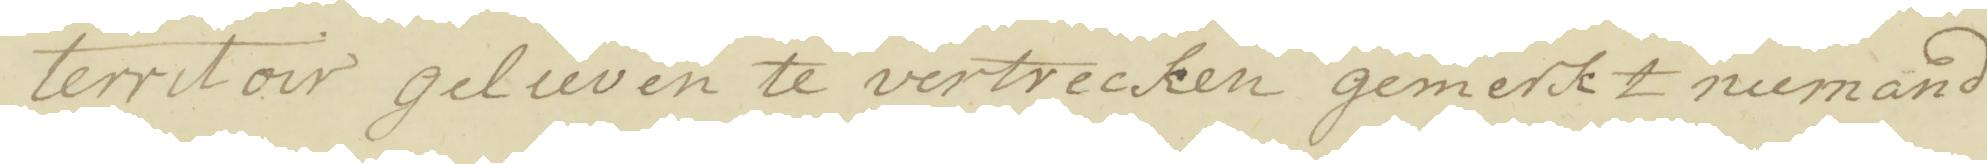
territoir gelieven te vertrecken gemerk 't niemand
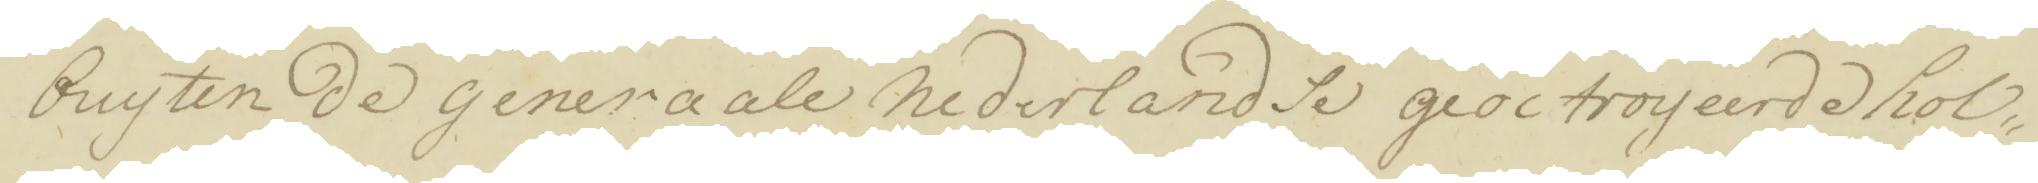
buyten de generaale nederlandse geoctroyeerde hol„
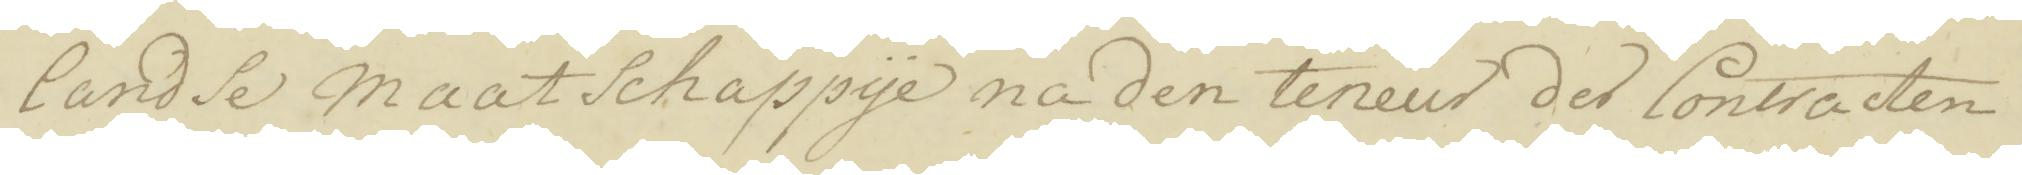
landse maat schappije na den teneur der Contracten
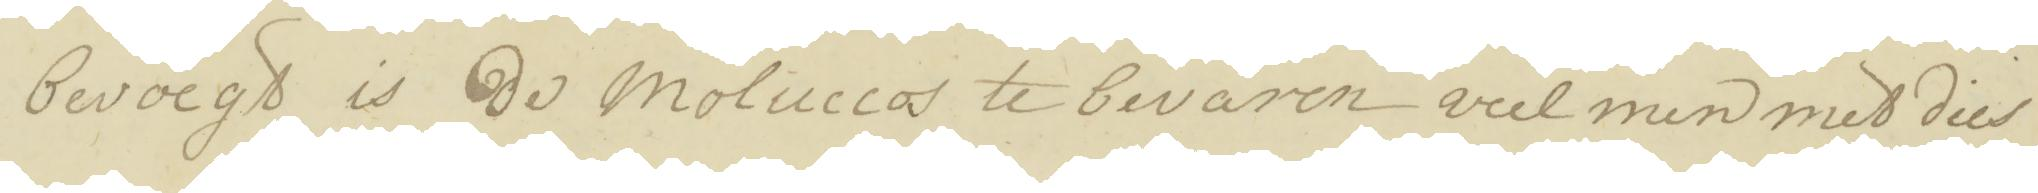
bevoegt is de Moluccos te bevaren veel min met dies
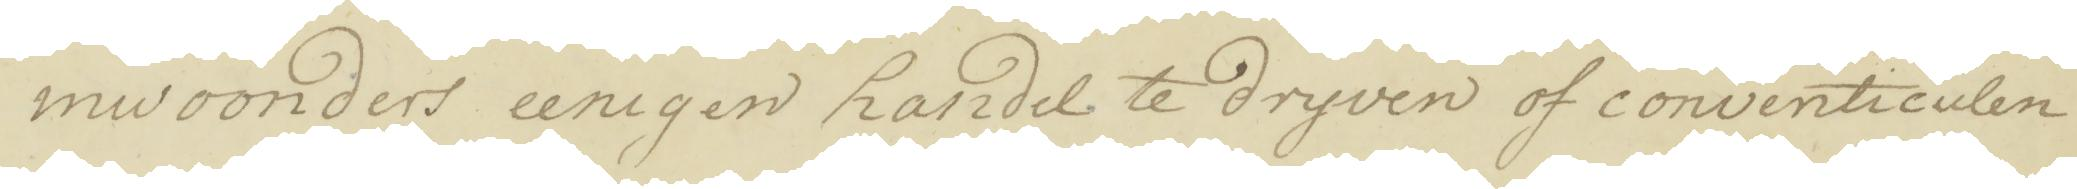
inwoonders eenigen handel te dryven of conventiculen
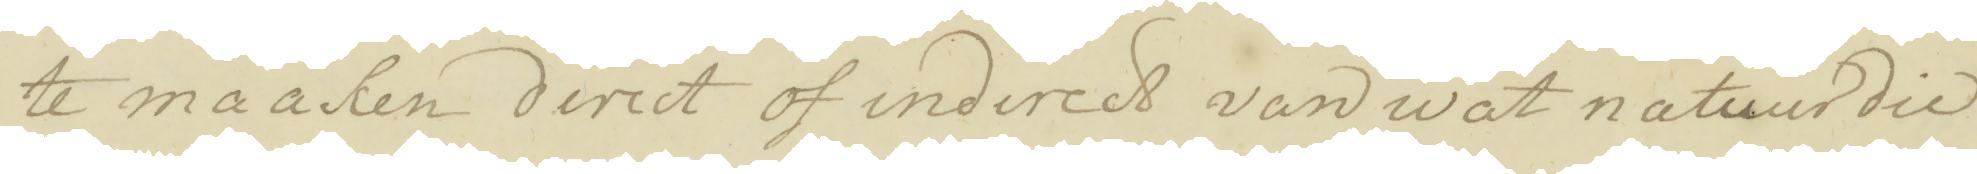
te maaken direct of indirect van wat natuur die
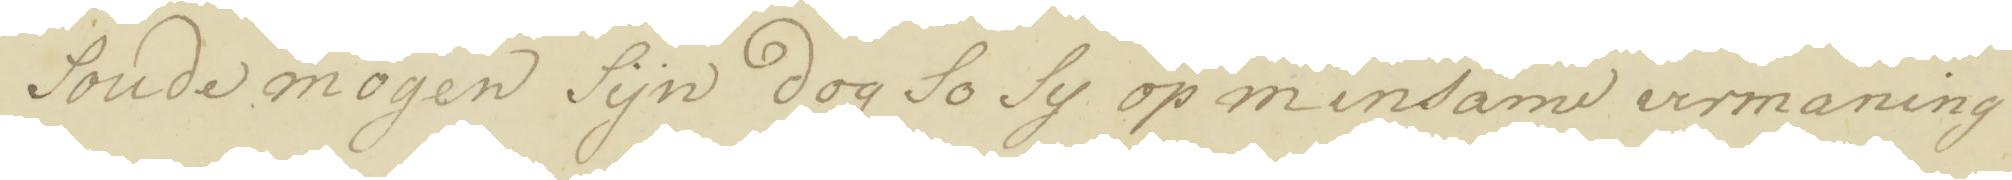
Soude mogen Sijn dog So Sy op minsame vermaning
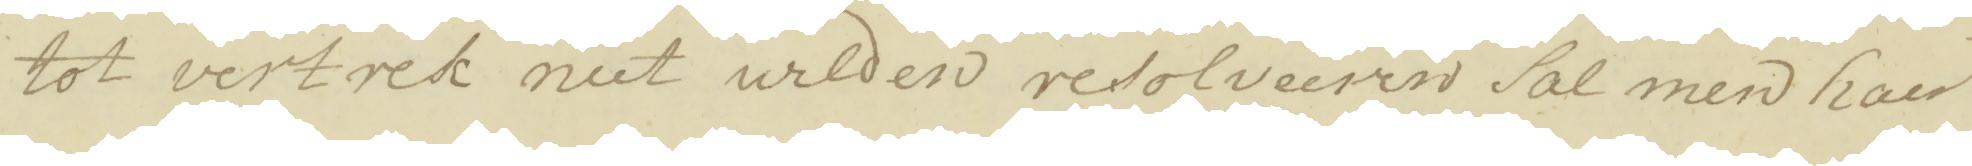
tot vertrek niet wilden resolveeren Sal men haer
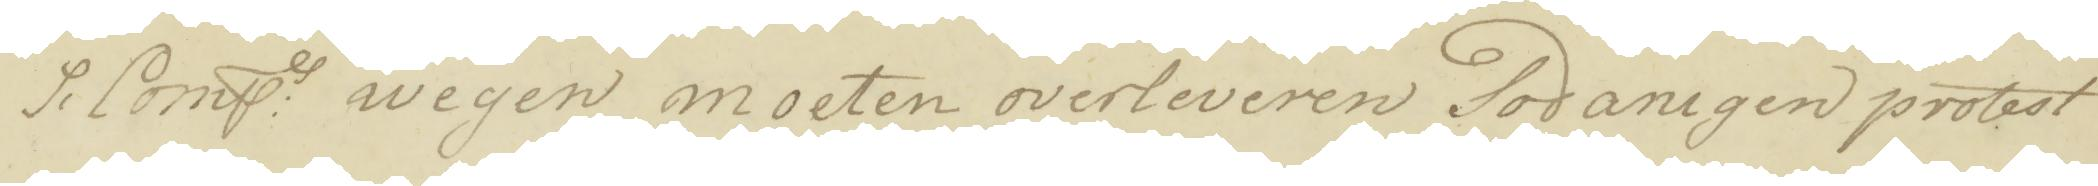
S: Comp:es wegen moeten overleveren Sodanigen protest
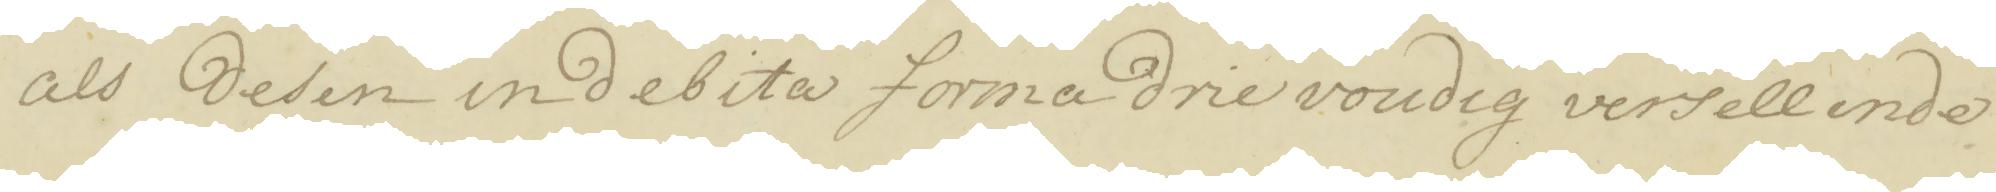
als desen in debita forma drie voudig versellende
